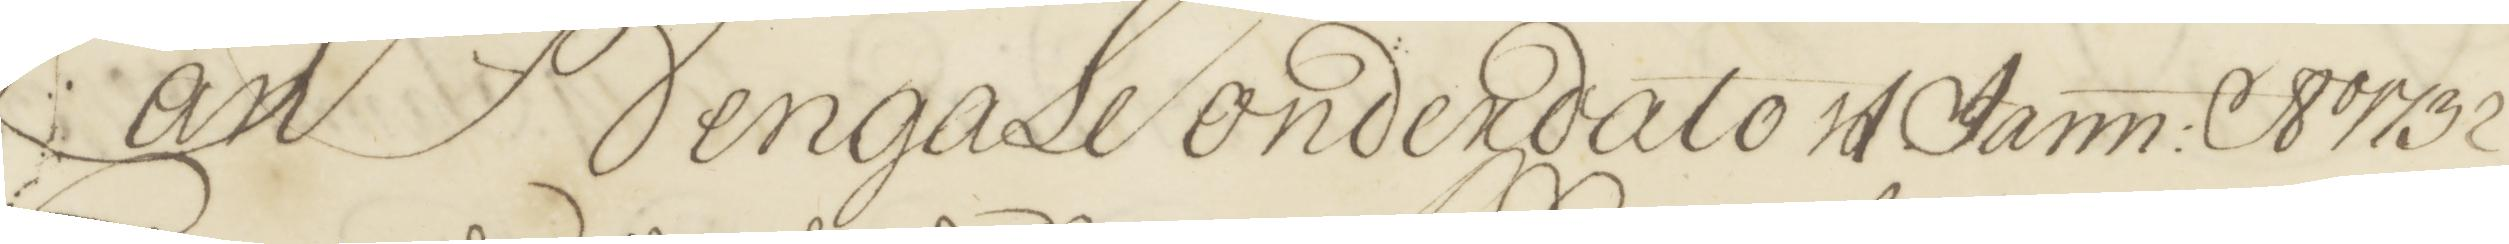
Van Bengale onder dato 14 Jann: Ao 1732
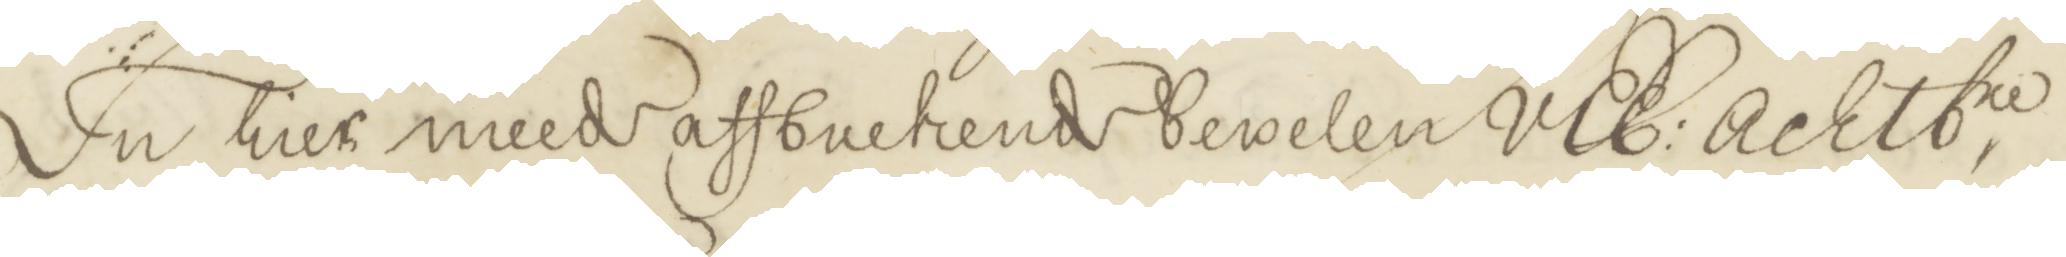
En hier meede affbrekende bevelen VEE: achtb„re
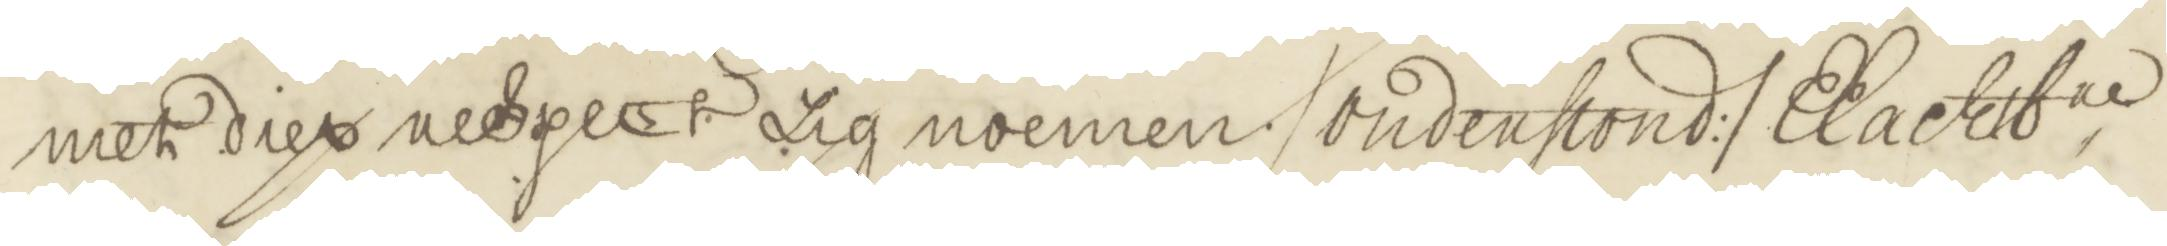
met diep respect zig noemen /onderstond:/ EEachtb„re
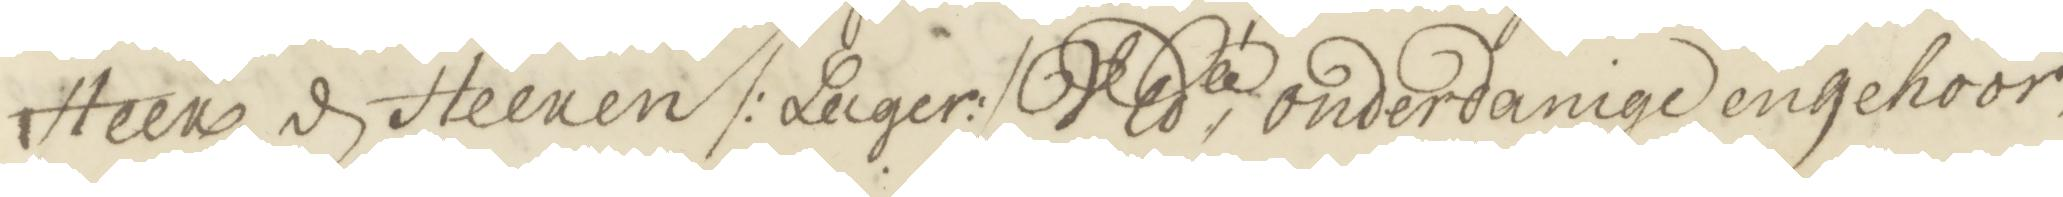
Heer en Heeren /:Lager:/ UEd„le onderdanige en gehoor
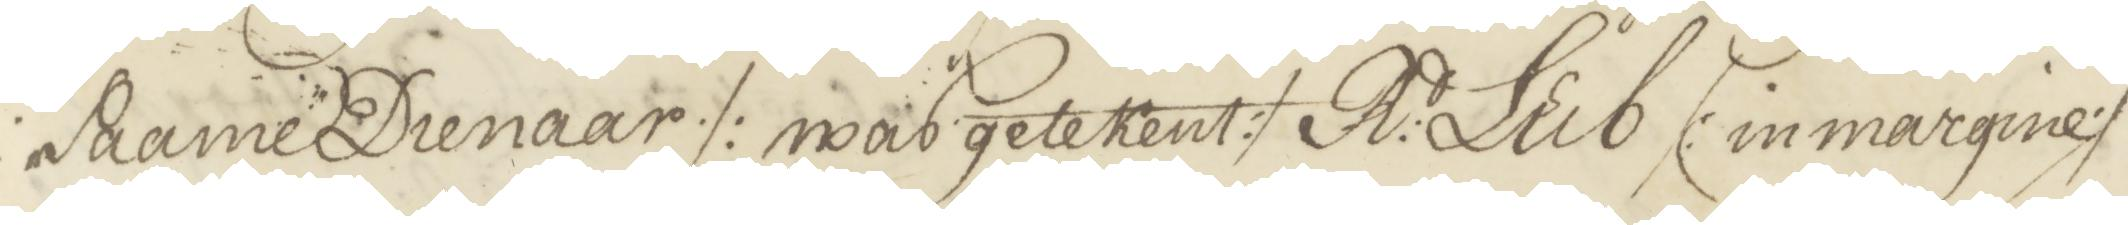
saame Dienaar /:was getekent:/ R:d Lub /:in margine:/
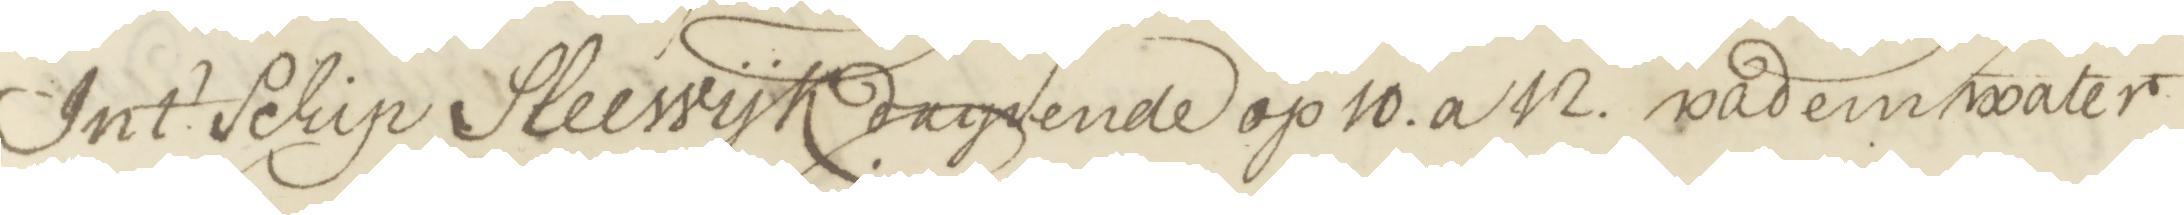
Int' schip Sleewijk drijvende op 10. a 12. vadem water
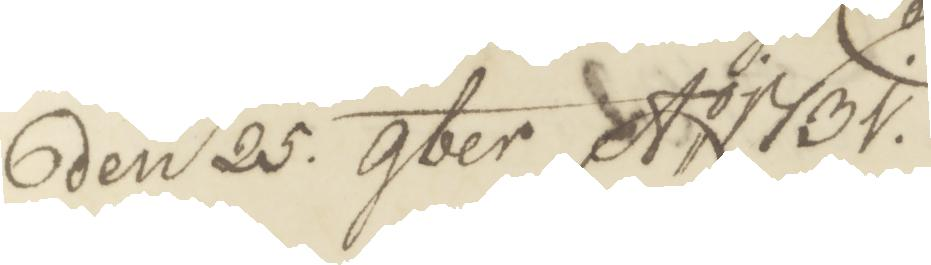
den 25. 9ber A„o 1731.
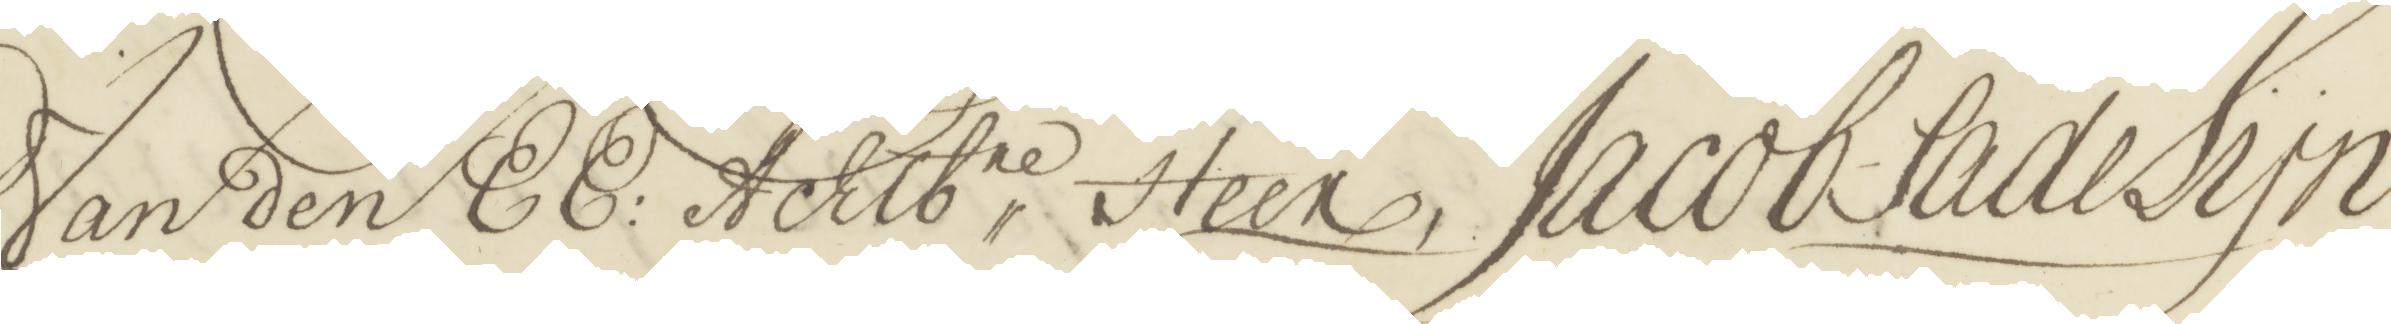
Van den EE: Achtb„re Heer Jacob Sadelijn
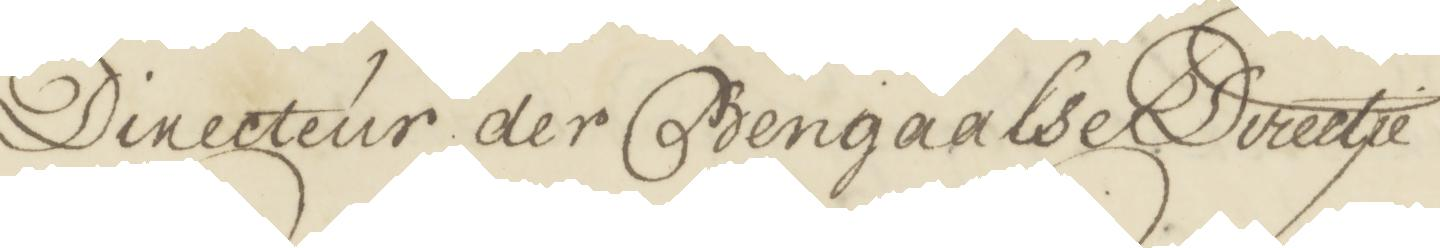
Directeur der Bengaalse Directie
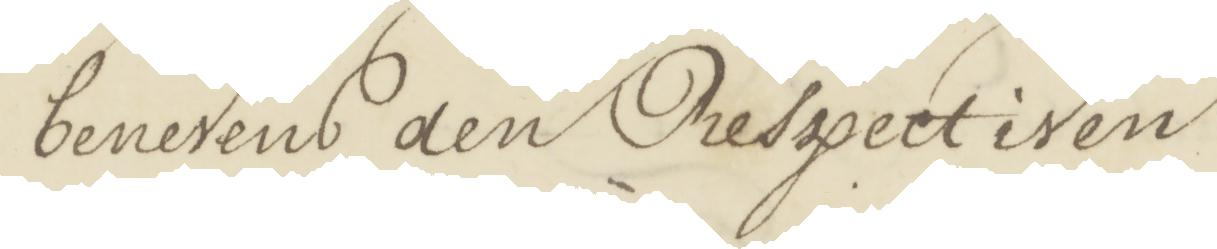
benevens den Respectiven
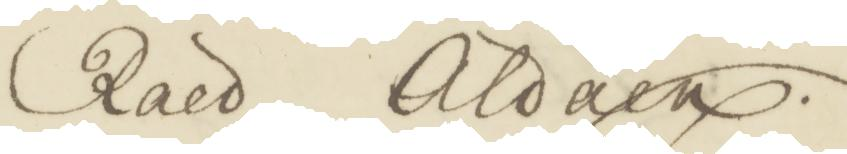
Raed Aldaer.
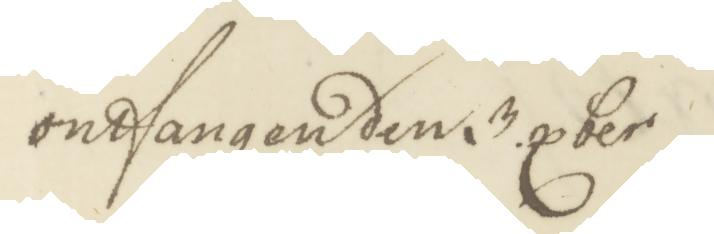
ontfangen den 3. xber
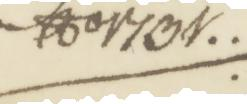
Ao 1731.
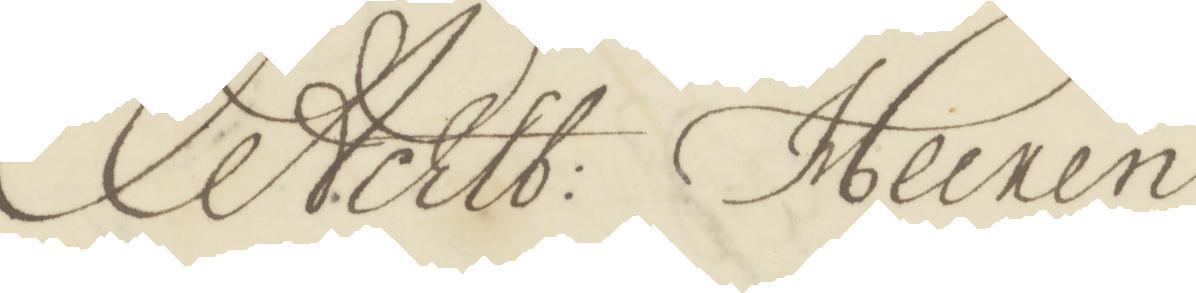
Achtb: Heeren
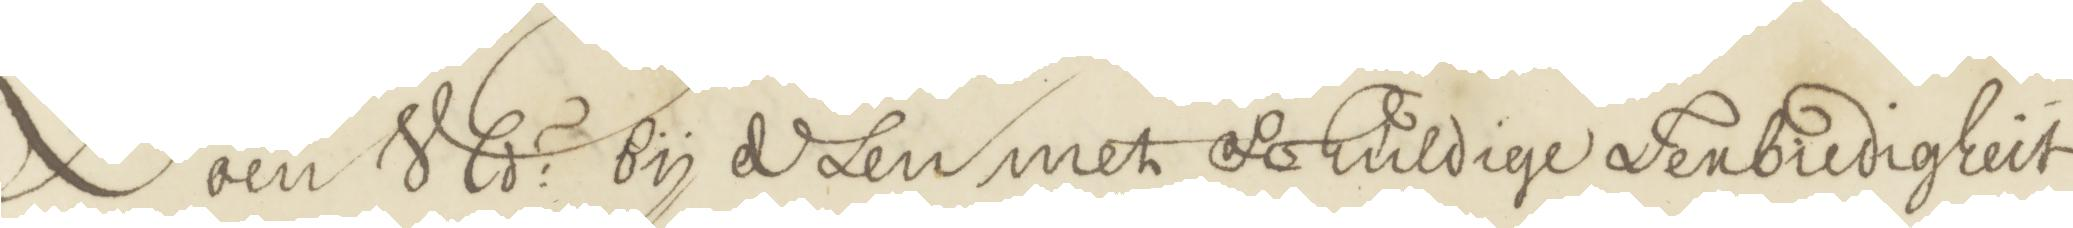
Doen VEd:' bij desen met schuldige Eerbiedigheit
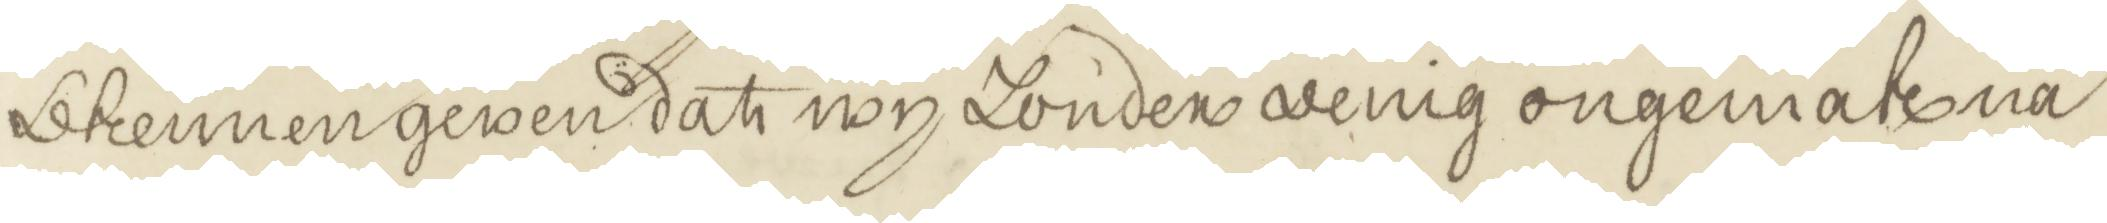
tekennen geven dat wij zonder eenig ongemak na
